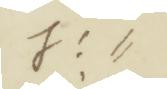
1: „
